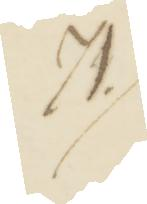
71.
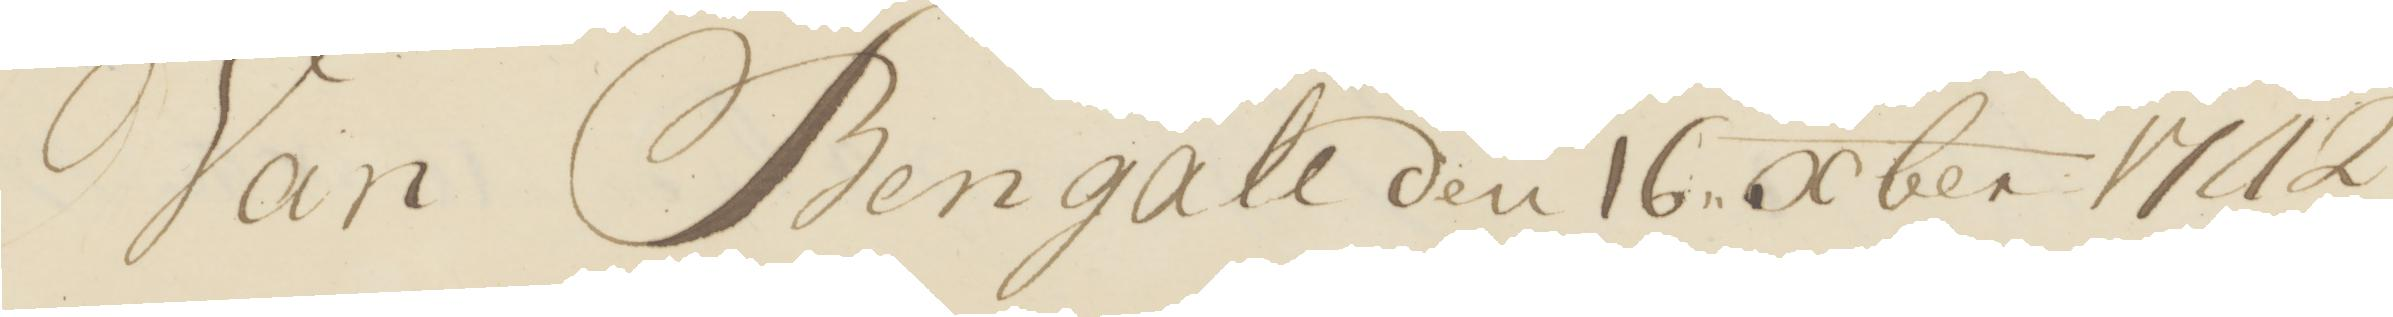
Van Bengale den 16„ xber 1742
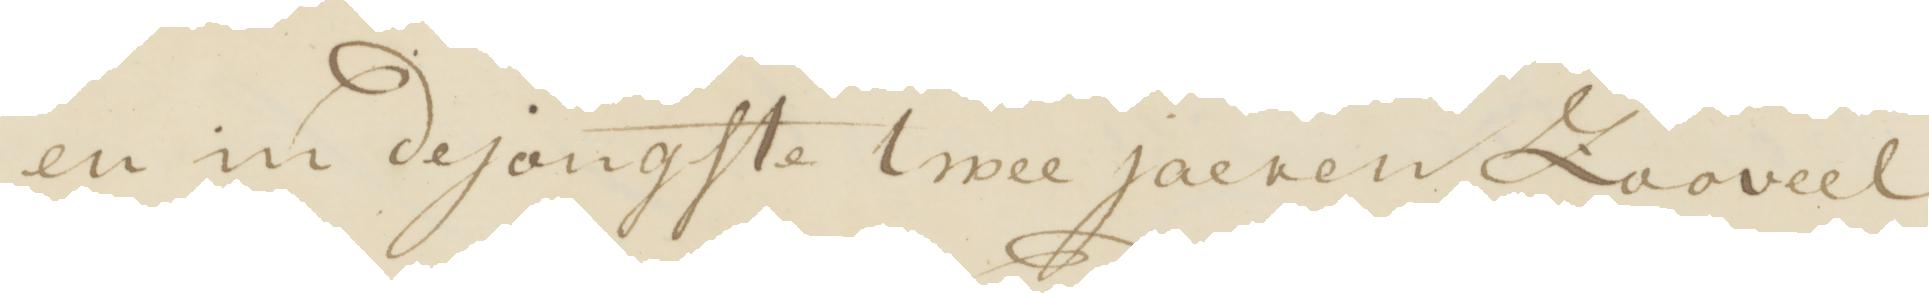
en in dejongste twee jaeren zooveel
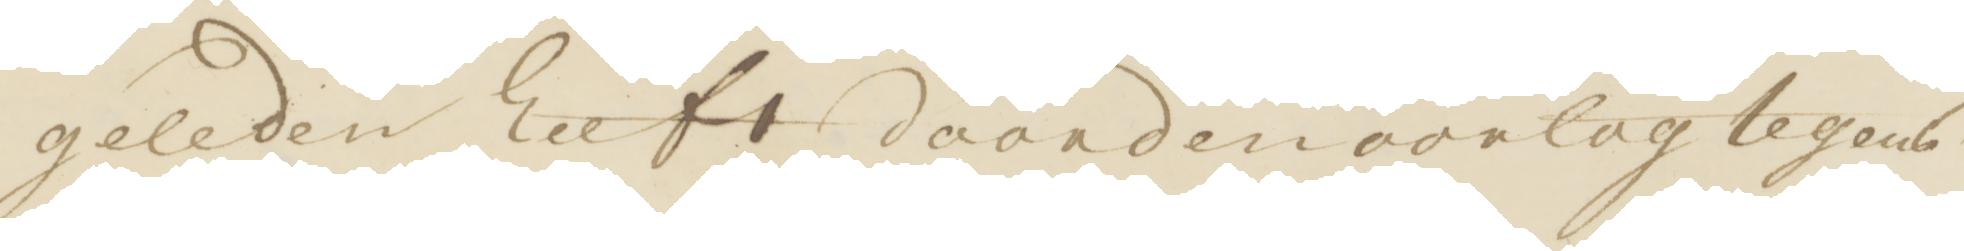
geleden heeft door den oorlog tegens
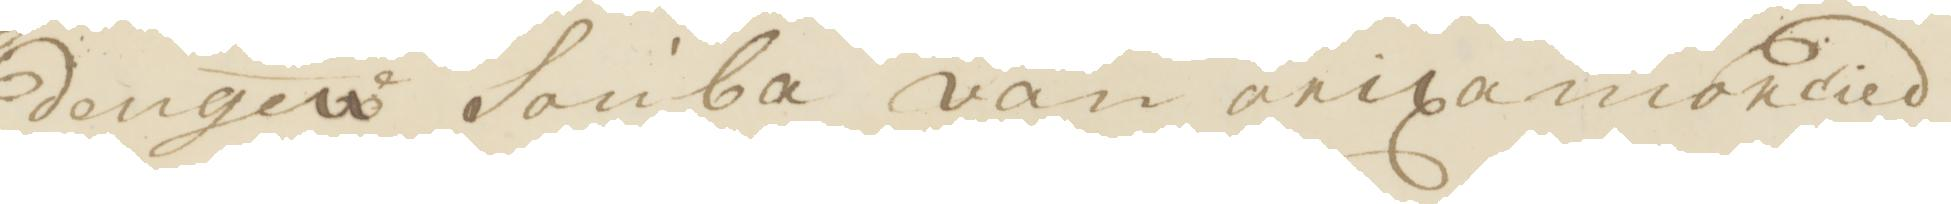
dengew souba van orixamorcied
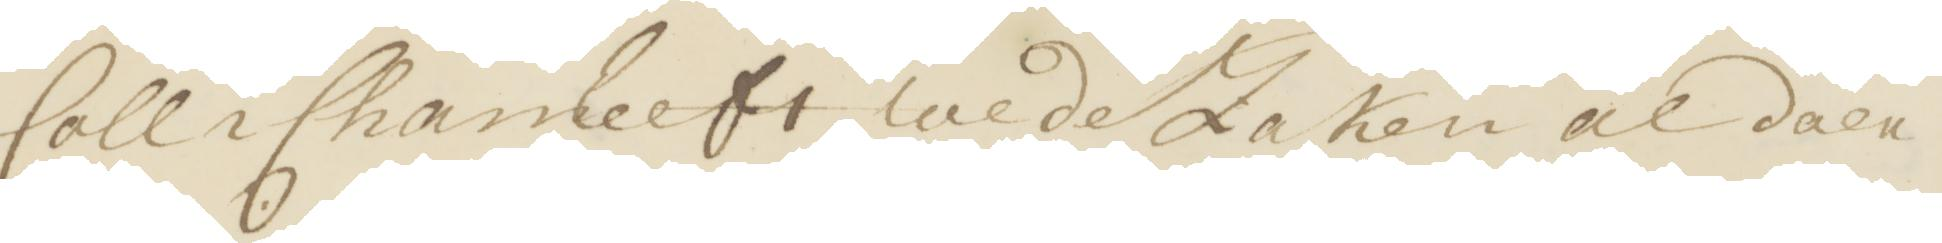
Colli Chan heeft toe de zaken al daer
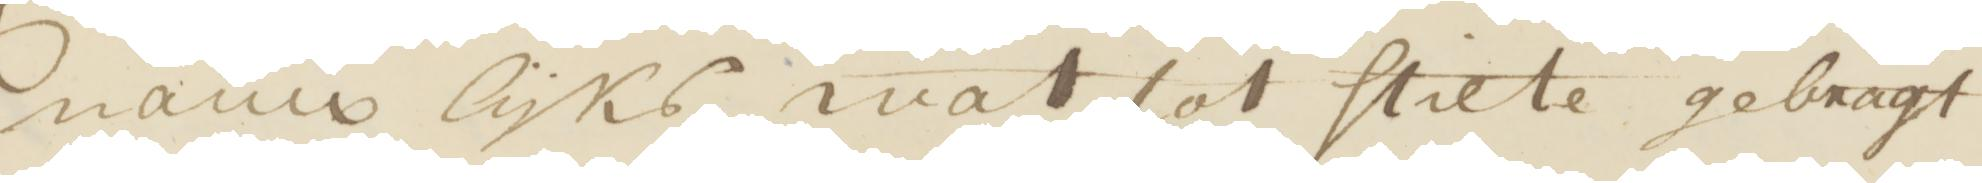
nauw lijks wat tot stiete gebragt
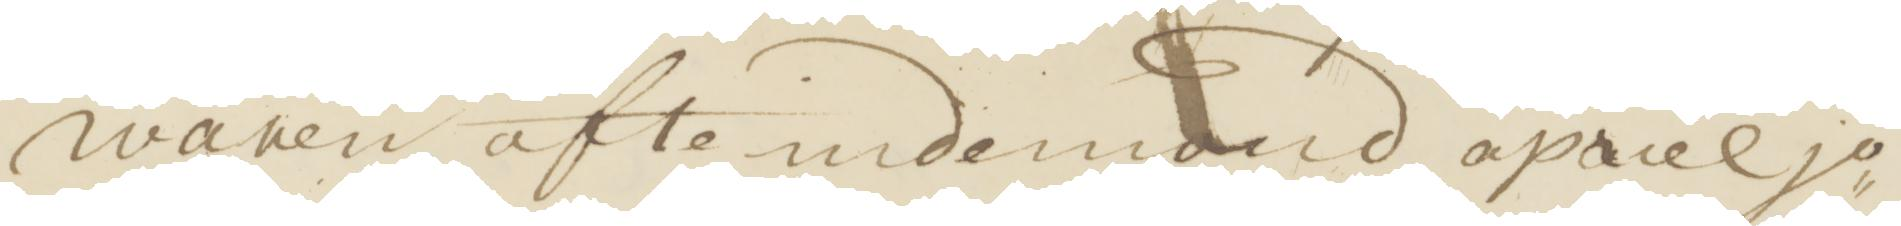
waren afte indemond oprielj„o
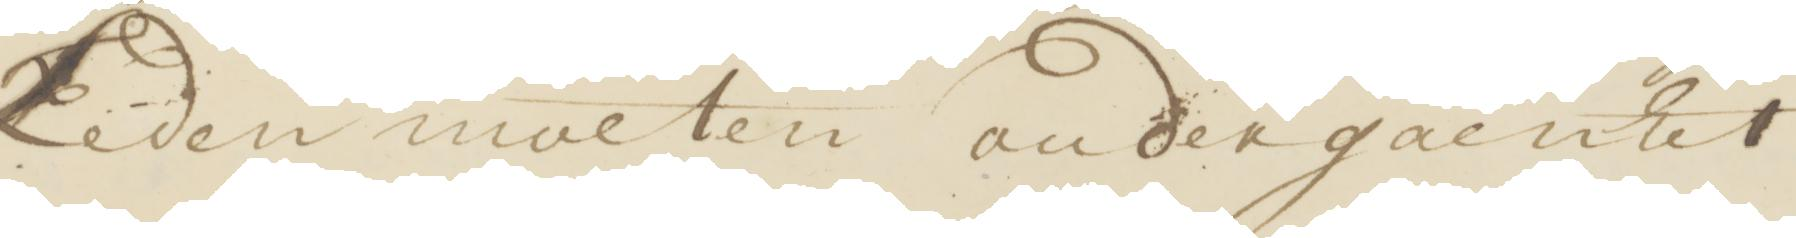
zeden moeten onder gaen het
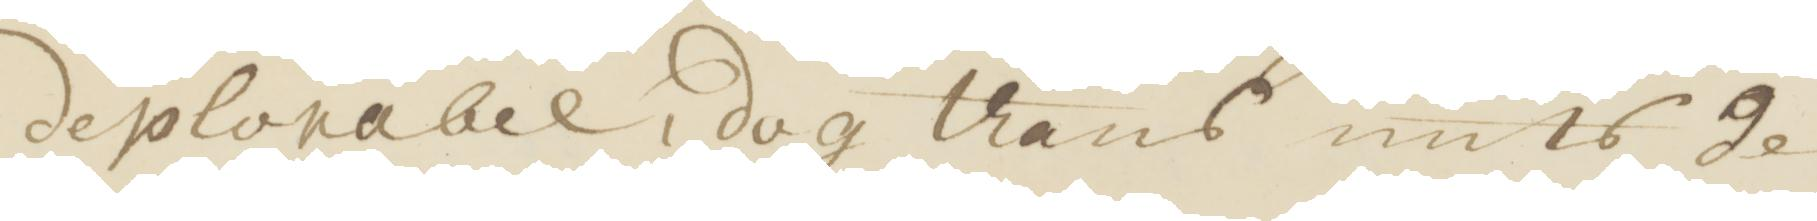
deplorabel, dog thans mits de
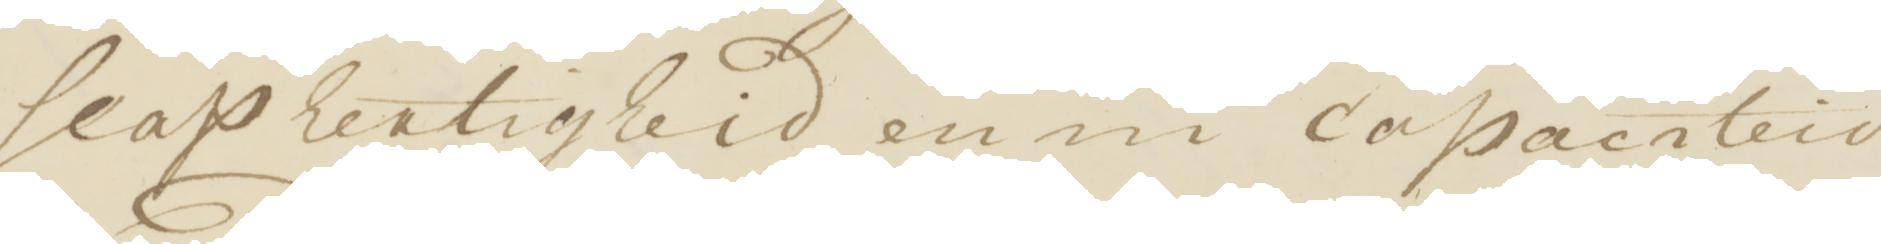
scap hertigheid en in capaciteid
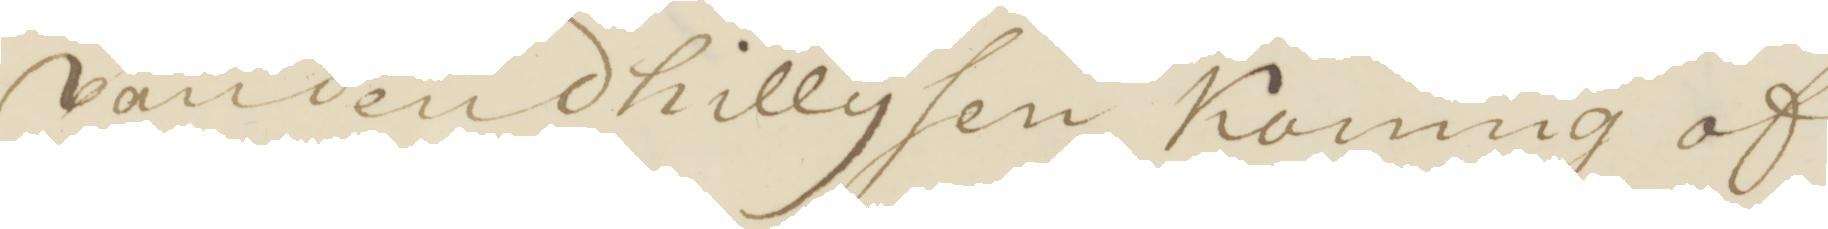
van den d hillijsen koning of
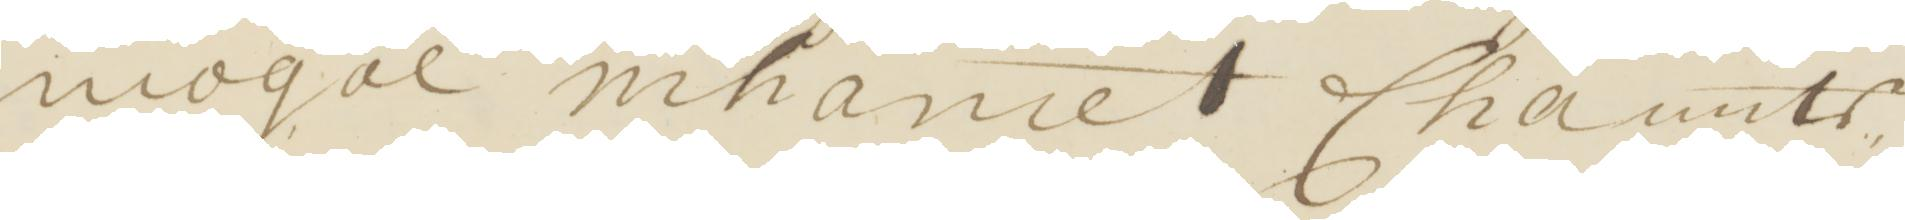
mogol inhamet Cha mits„
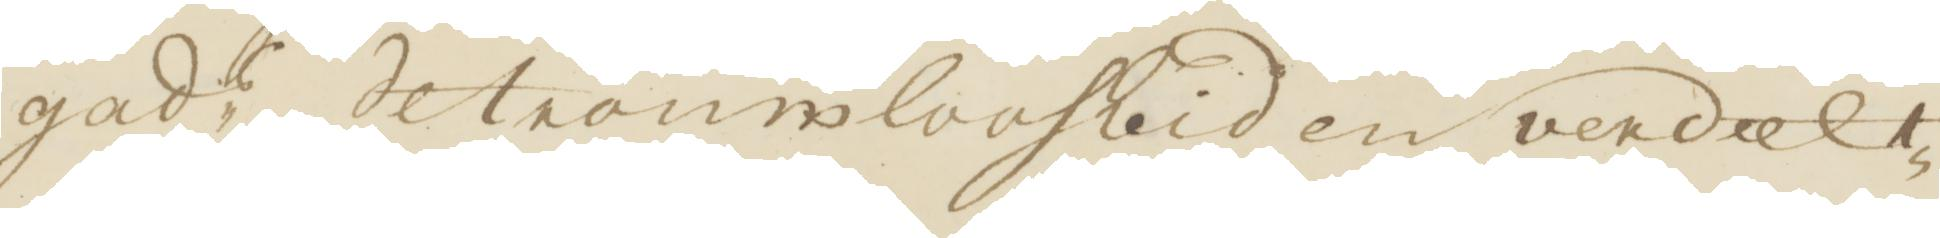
gad„s de trouwloosheid en verdeelt„
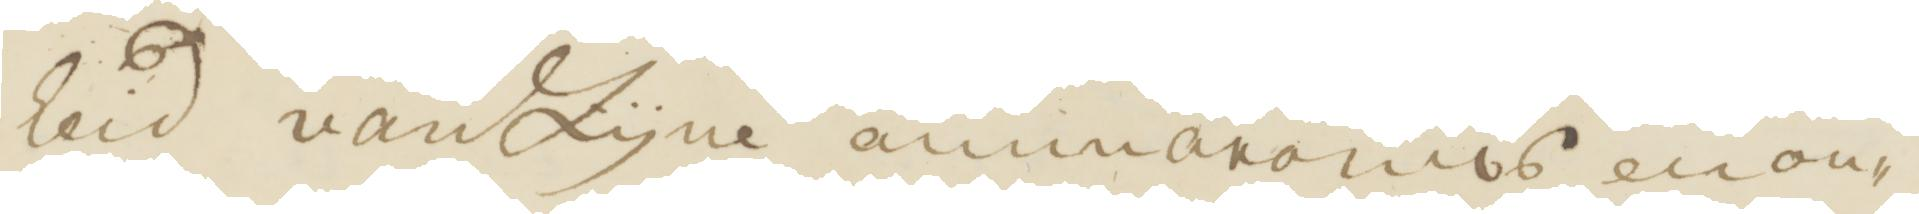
heid van zijne ammarouws en on„
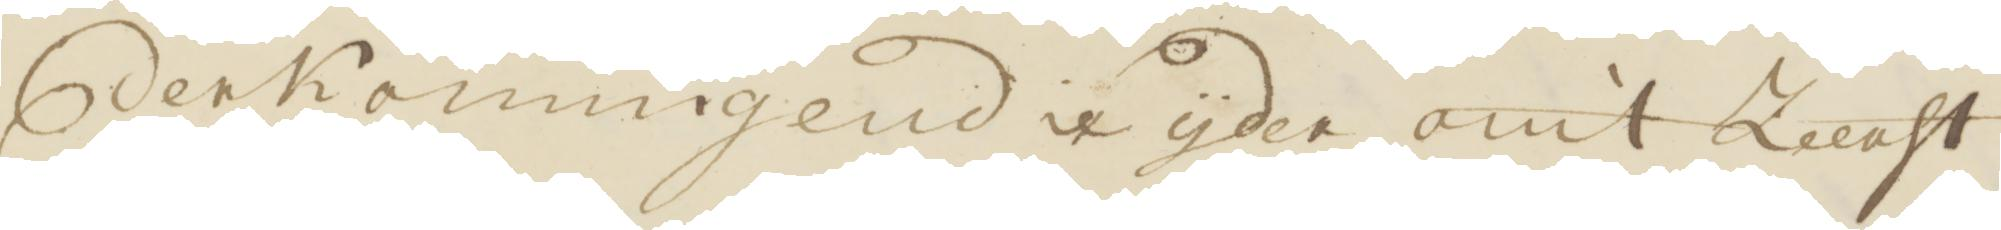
der komingen die ijder om ’t zeerst
